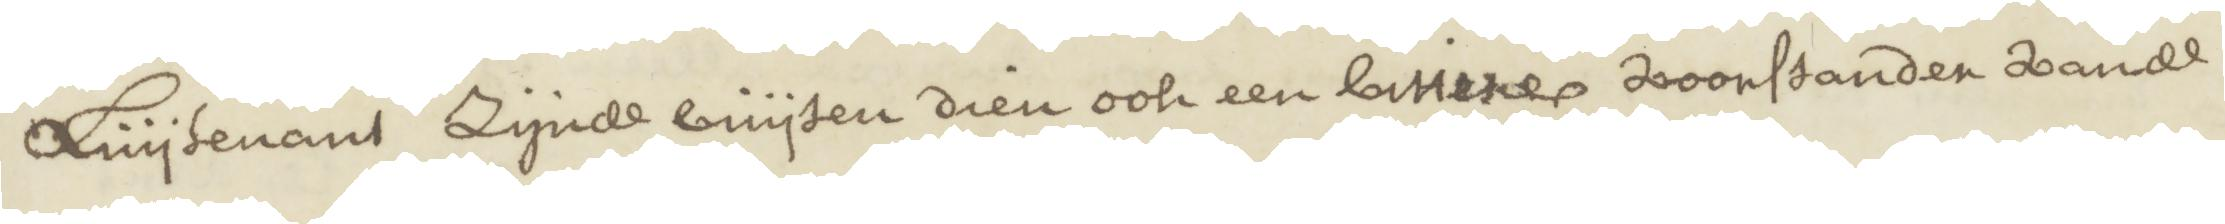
Luijtenant zijnde buijten dien ook een bittere voorstander vande
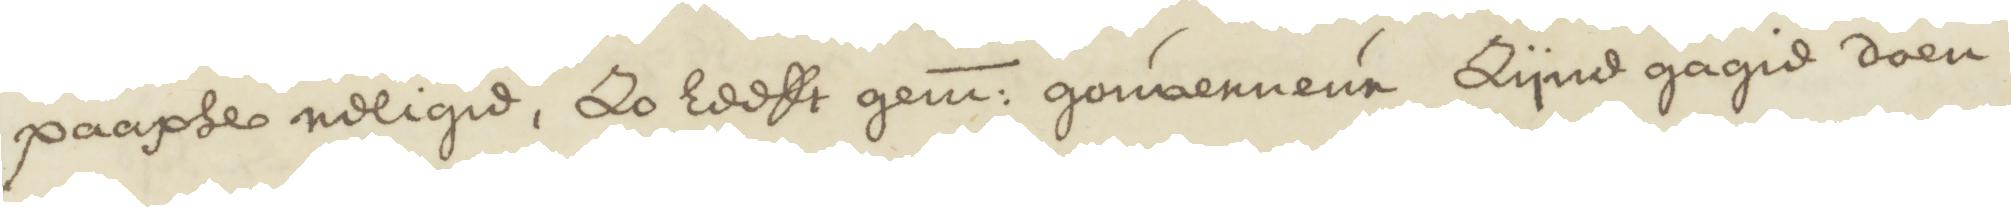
paapse religie, zo heeft gem: gouverneur zijne gagie doen
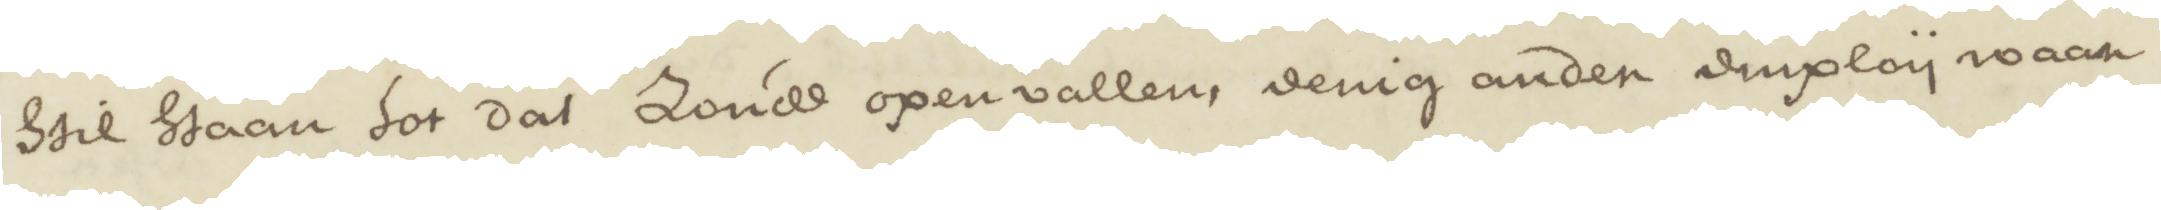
stil staan tot dat zoude open vallen, eenig ander emploij waar
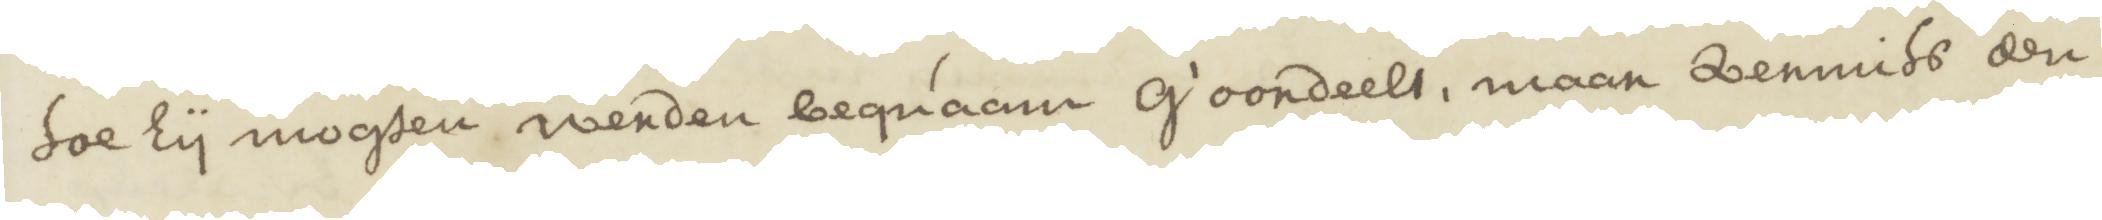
toe hij mogten werden bequaam g’oordeelt, maar vermits den
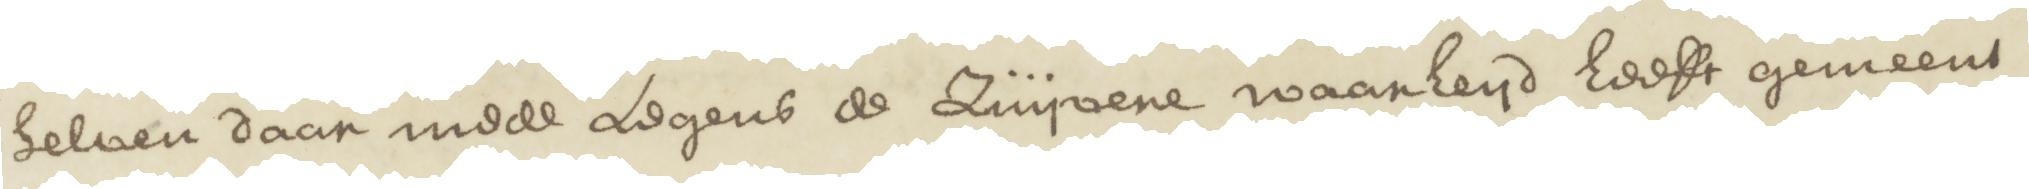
selven daar mede tegens de zuijvere waarheyd heeft gemeent
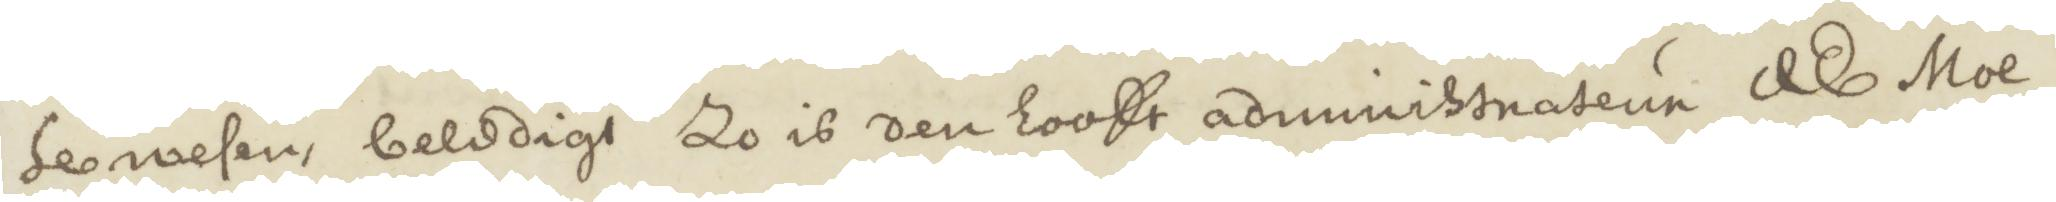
te wesen, beledigt zo is den hooft administrateur dE Mol
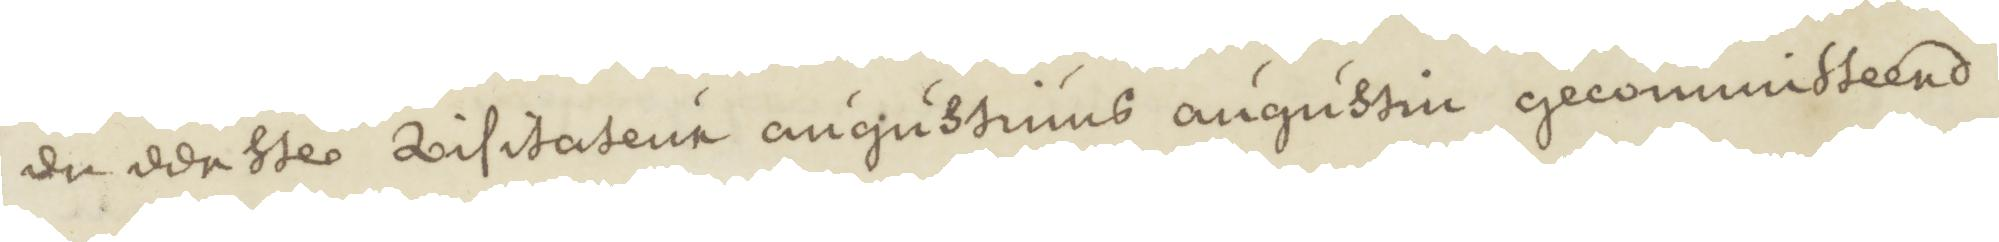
en eerste visitateur augustinus augustin gecommitteerd
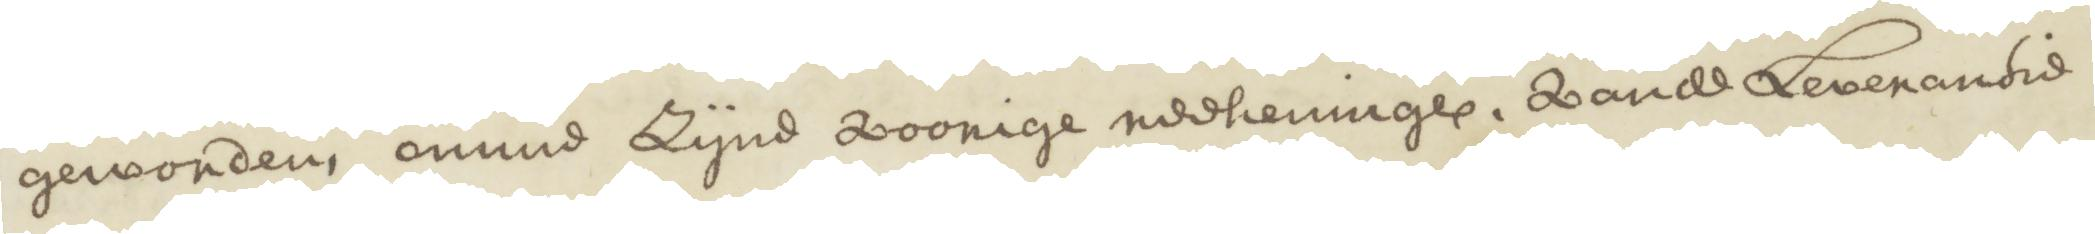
geworden, omme zijne voorige reekeninge, van de Leverantie
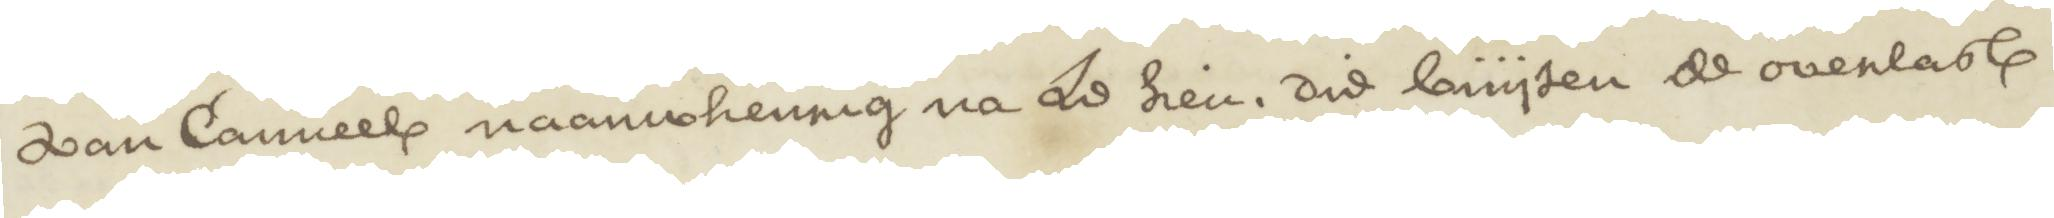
van Canneel naauwkeurig na te sien, die buijten de overlast
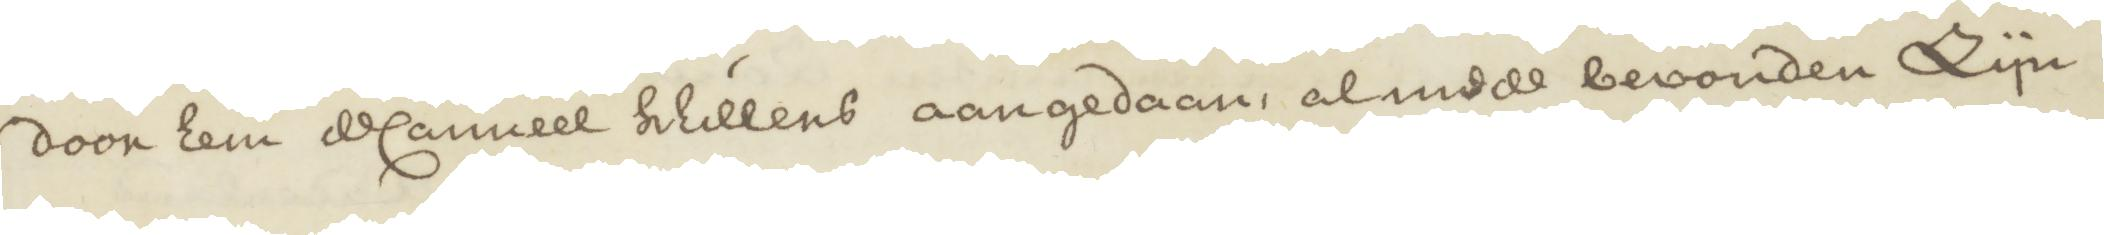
door hem de Canneel schillers aangedaan, almede bevonden zijn
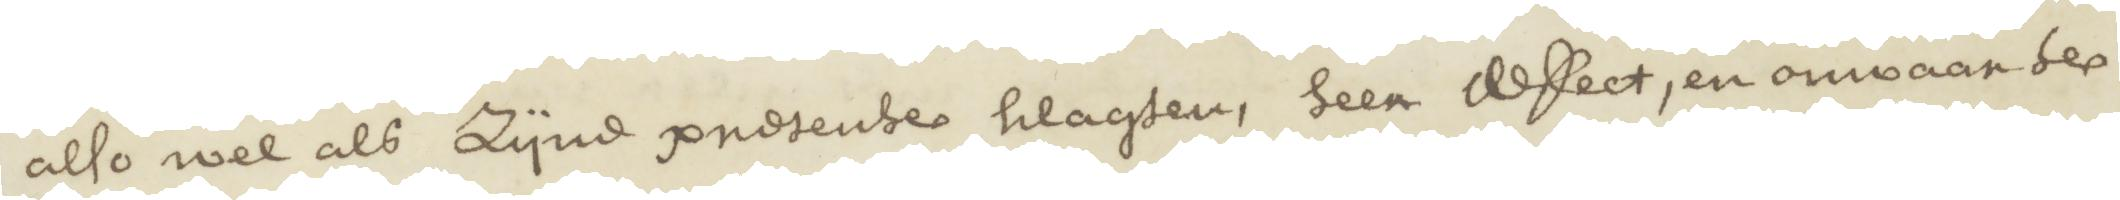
also wel als zijne pretense klagten, seer defect, en onwaar te
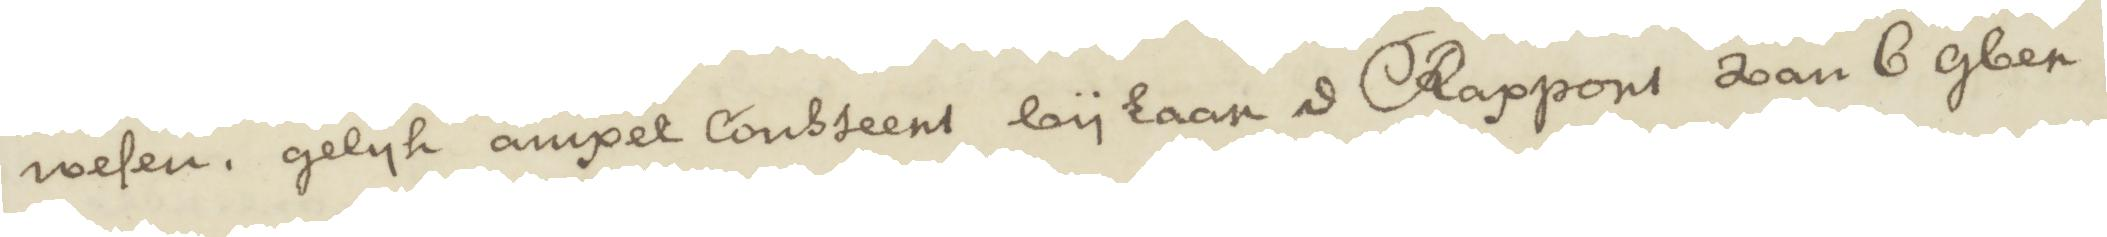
wesen, gelijk ampel Consteert bij haar e Rapport van 6 gber
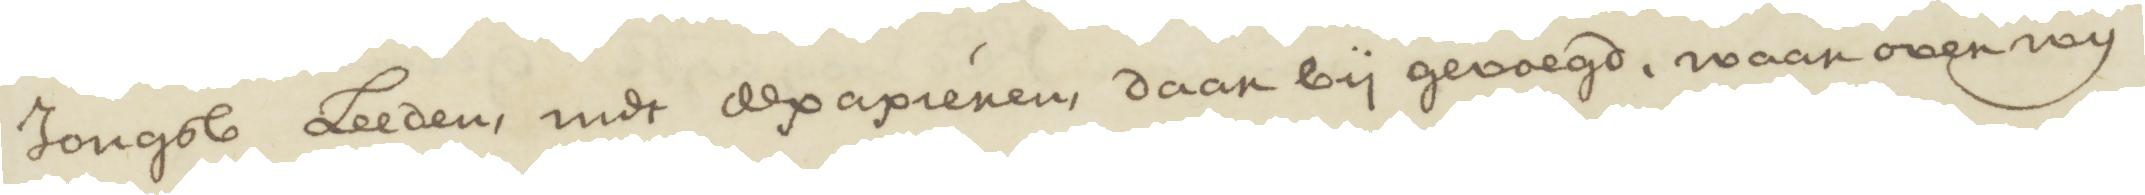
Iongst Leeden, met depapieren, daar bij gevoegd, waar over wij
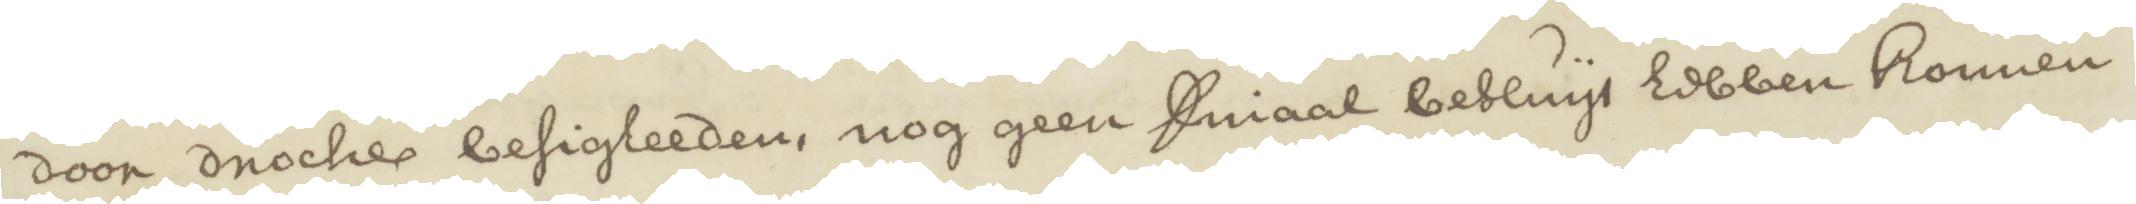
door drocke besigheeden, nog geen fniaal besluijt hebben komen
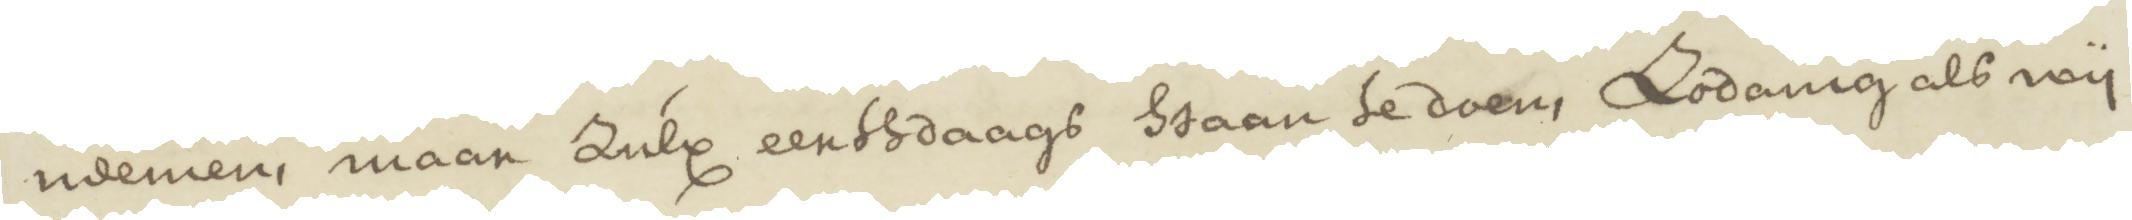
neemen, maar zulx eertsdaags staan te doen, zodanig als wij
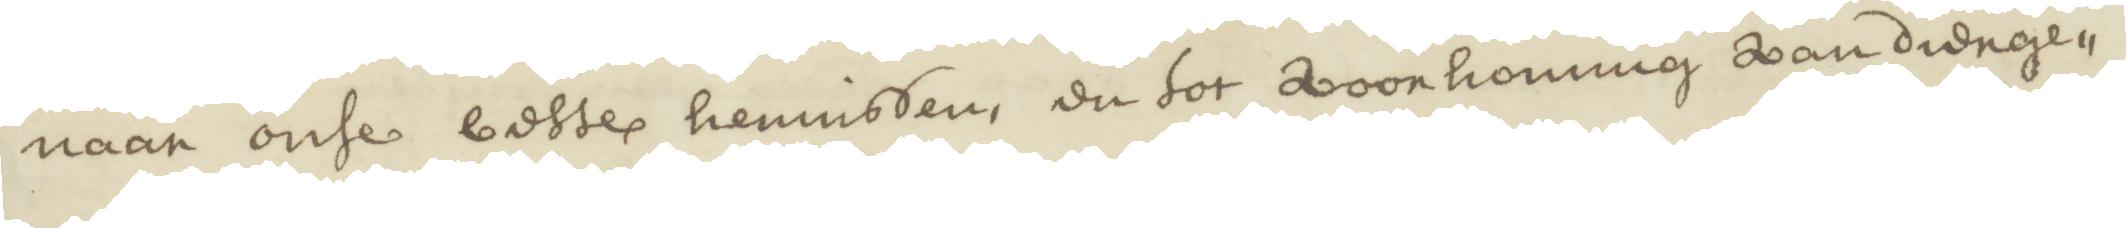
naar onse beste kennissen, en tot voorkoming van dierge„
